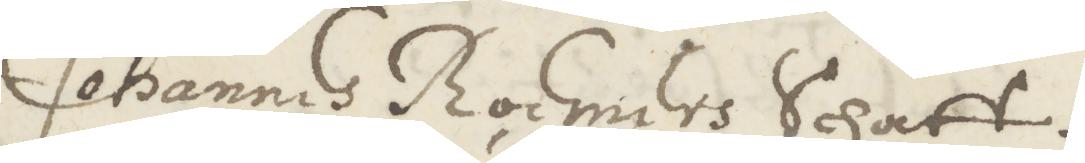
Johannes Roemers Schaff.
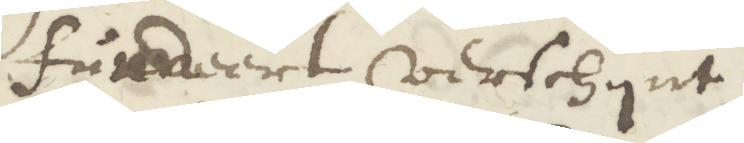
fundeert verschynt
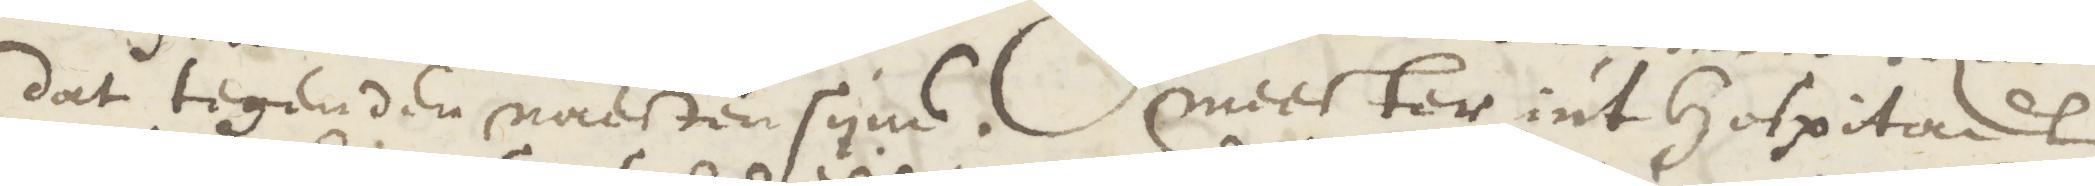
dat tegen den naesten sijne meester in't Hospitael
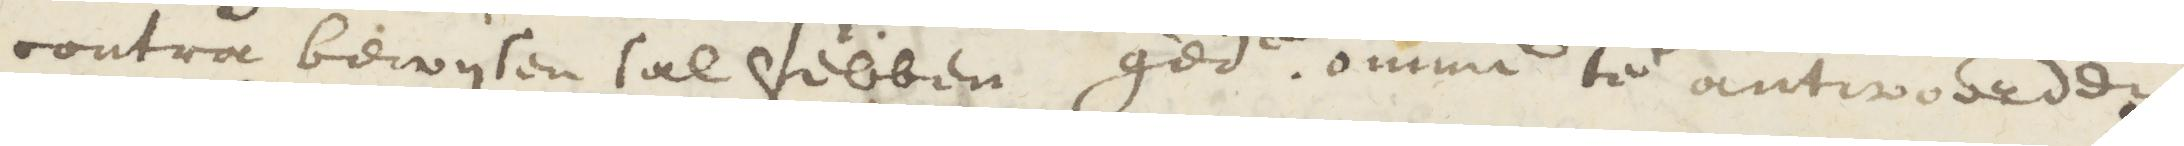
contra bewysen sal hebben ged.e omme te antwoerden
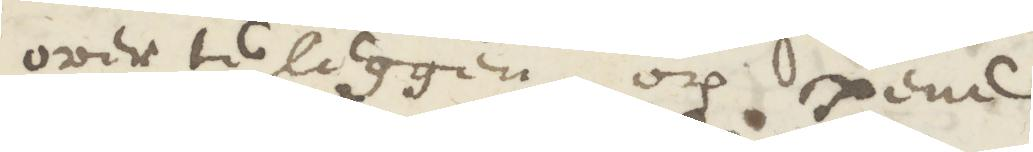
over te leggen, op pene
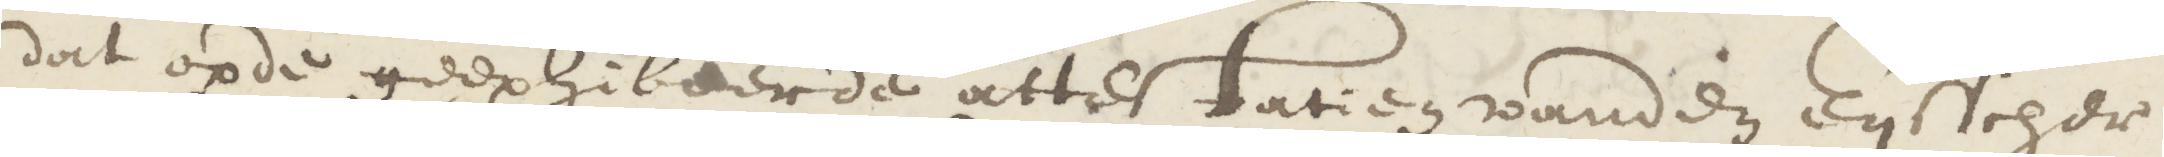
dat opde geexhibeerde attestatien vanden Eysscher
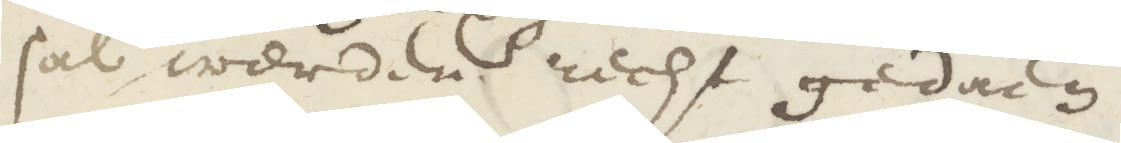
sal werden recht gedaen
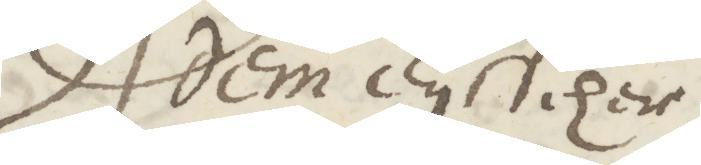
Jdem Eysscher
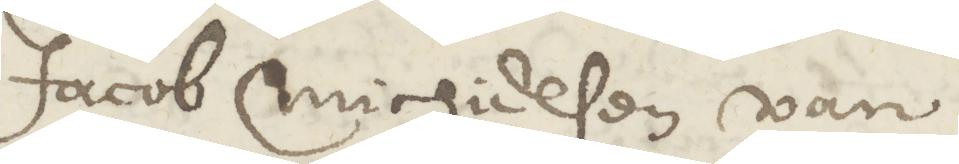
Jacob Michielsen van
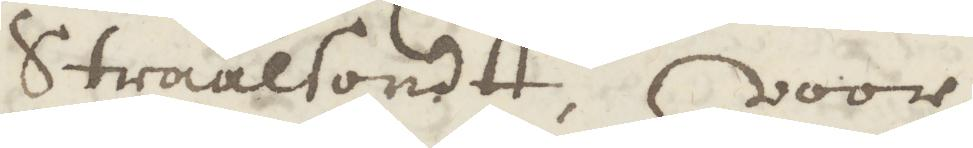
Straalsondt, voor
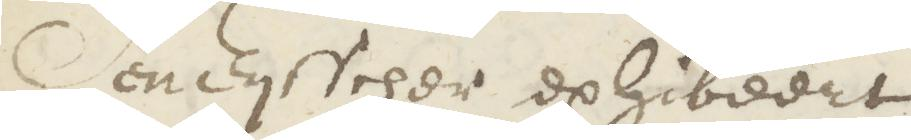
Den Eysscher exhibeert
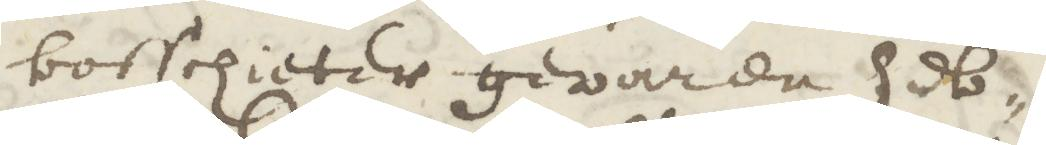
bosschieter gevaren heb„
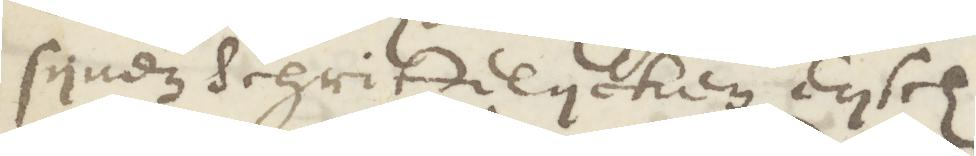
sijnen schriftelycken eysch
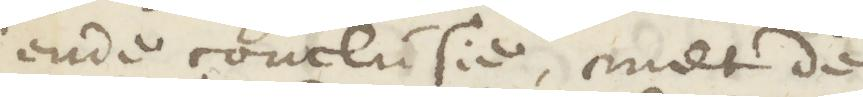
ende conclusie, met de
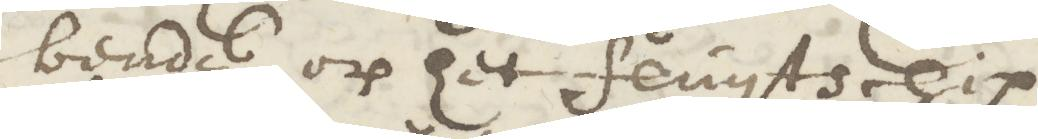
bende op het fluytschip
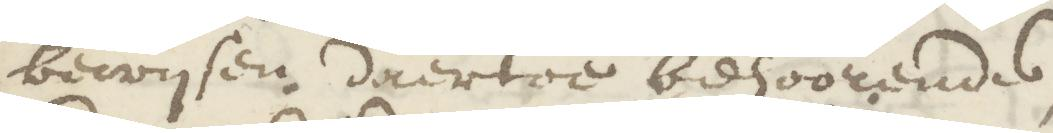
bewysen daertoe behoorende,
